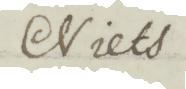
Niets
